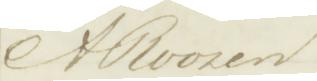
ARoozen
